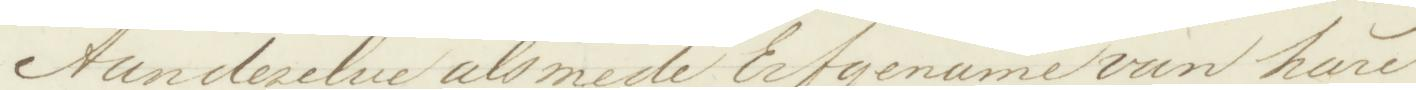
Aan dezelve als mede Erfgename van hare
